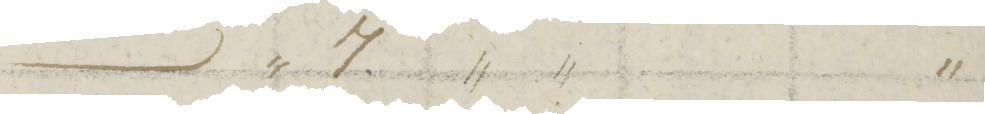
— „ 7. „ „ „
